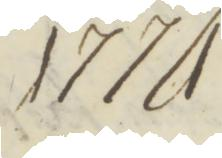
1774
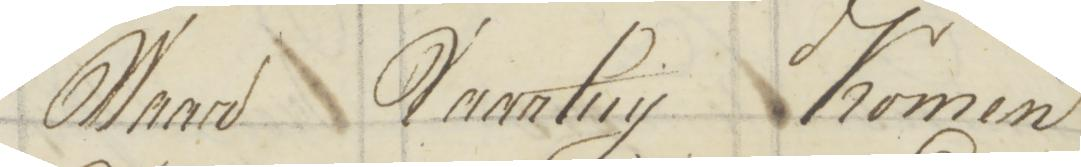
Waar Vaartuij Komen
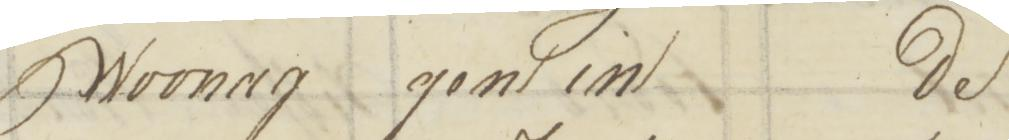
woonag gen in de
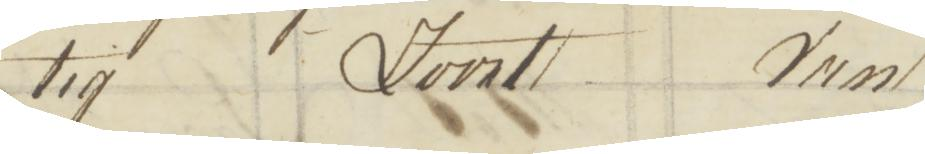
tig Zoort van
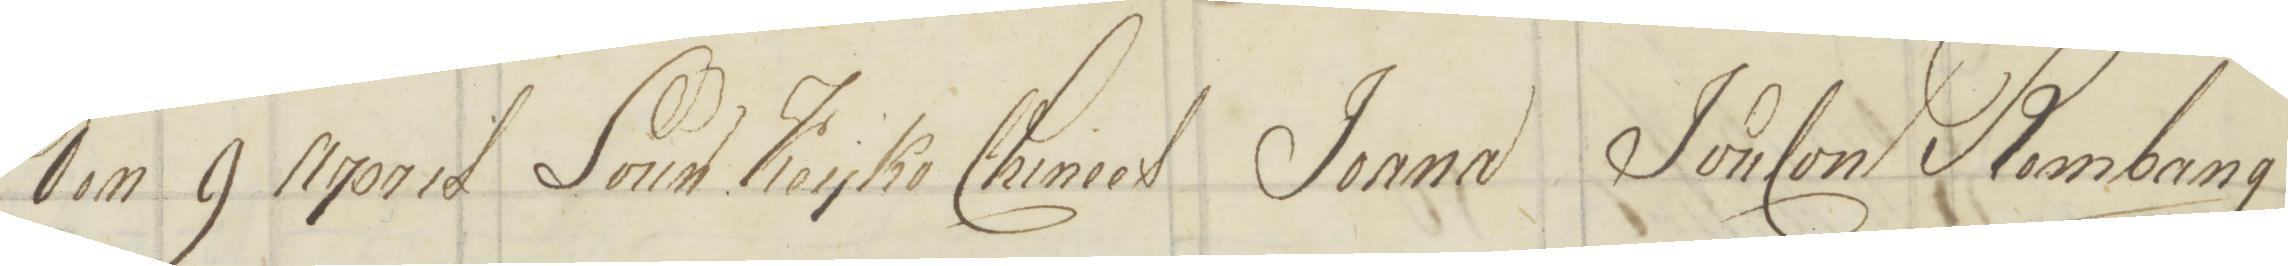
den 9 april Soun Keijko Chinees Joana Joulon Rembang
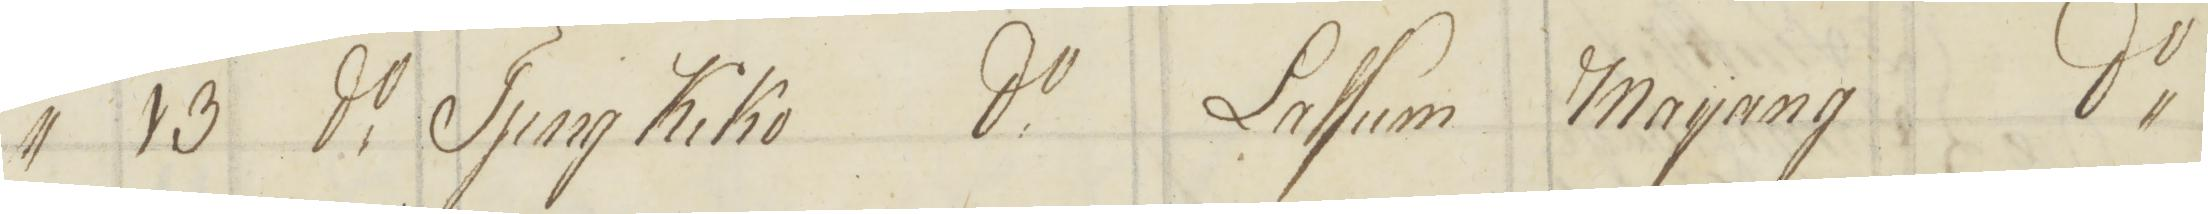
„ 13 d„o Tjing Kiko d„o Lassum Maijang d„o
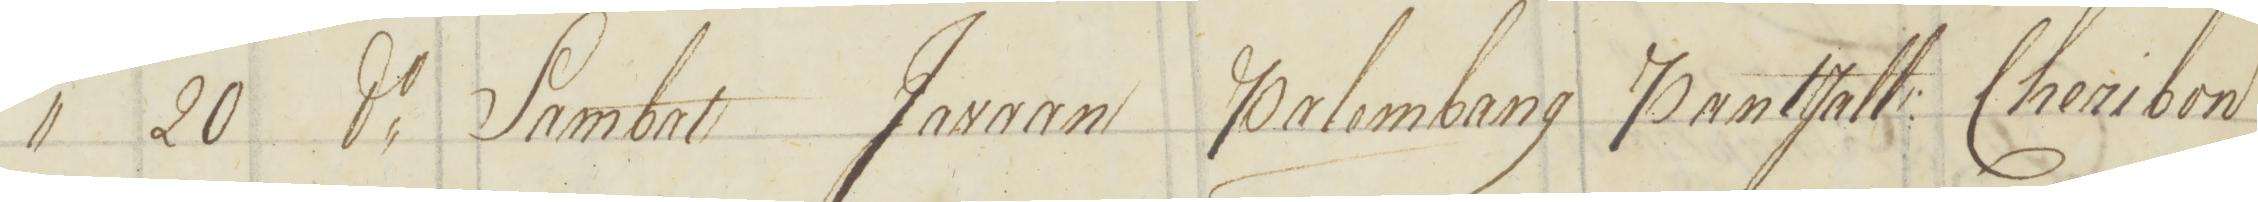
„ 20 d„o Sambat Javaan Palembang Pantjall: Cheribon
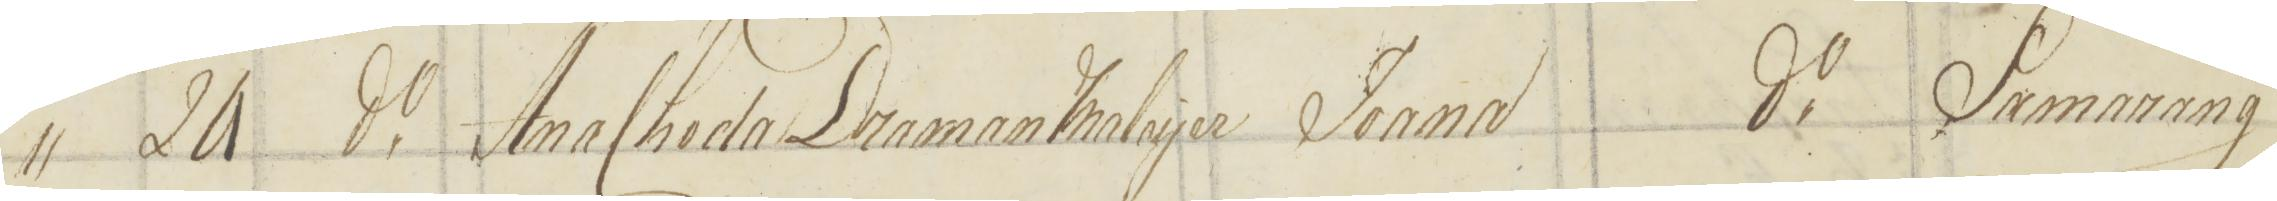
„ 24 d„o Anachoda Draman Malaijer Joana d„o Samarang
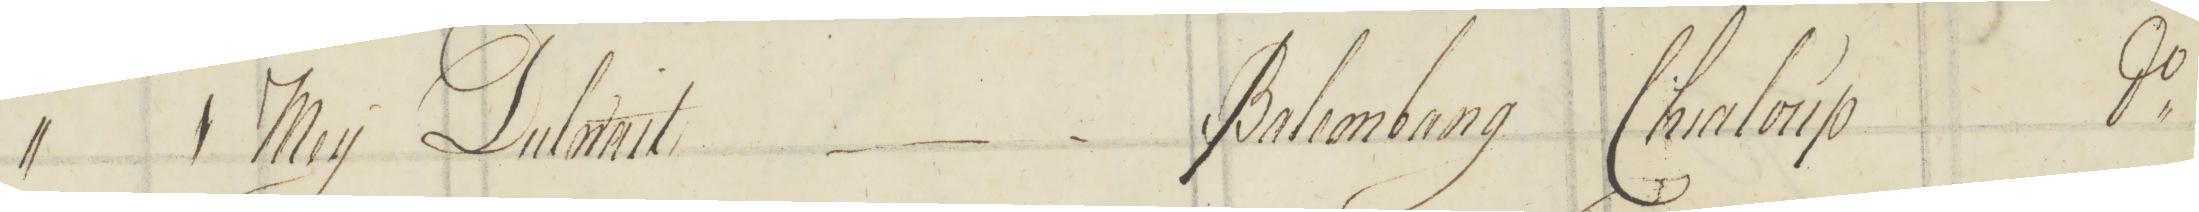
„ 1 Meij Dulwait Balembang Chialoup d„o
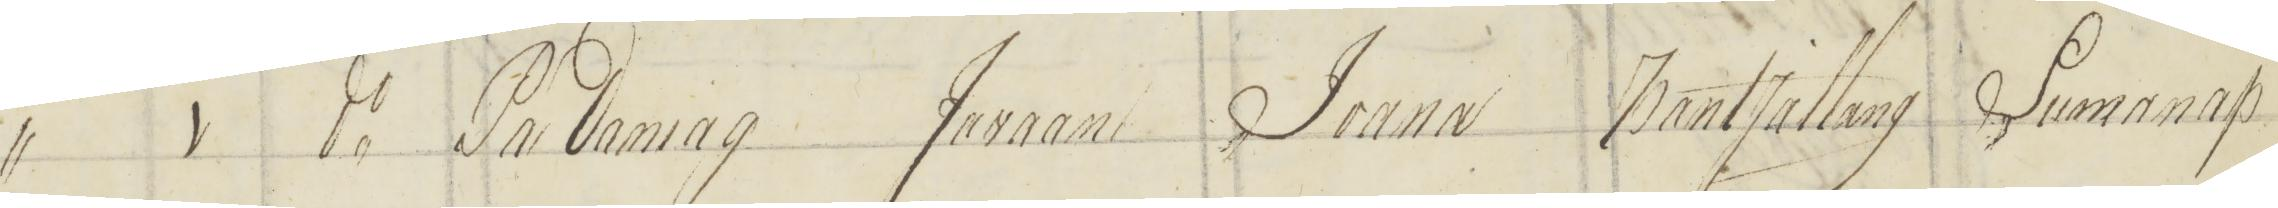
„ 1 d„o Pa daniag Javaan Joana Pantjallang Sumanap
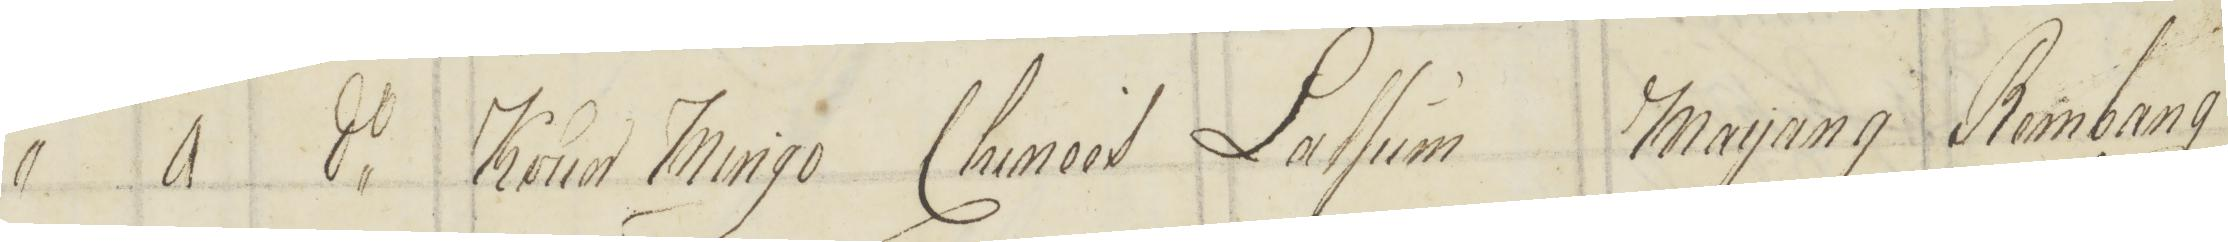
„ 4 d„o Kouw Mingo Chinees Lassum Maijang Rembang
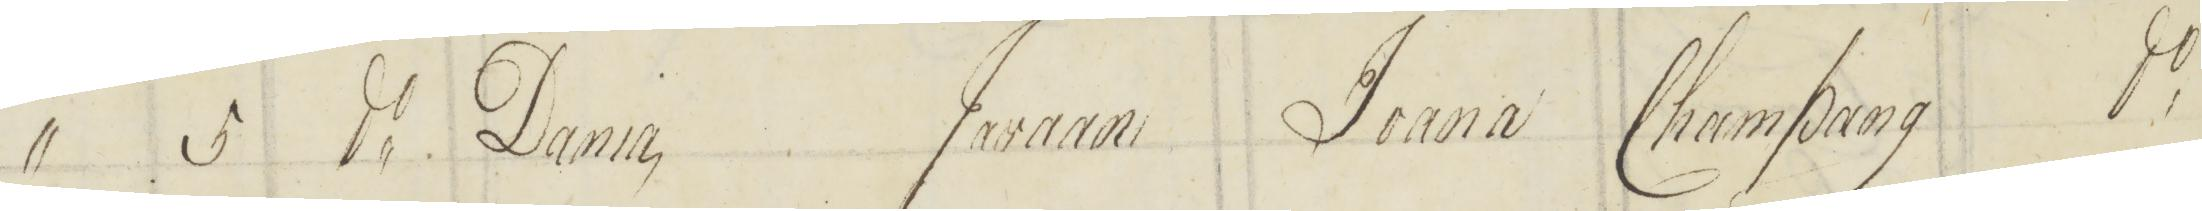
„ 5 d„o Danian Javaan Joana Champang d„o
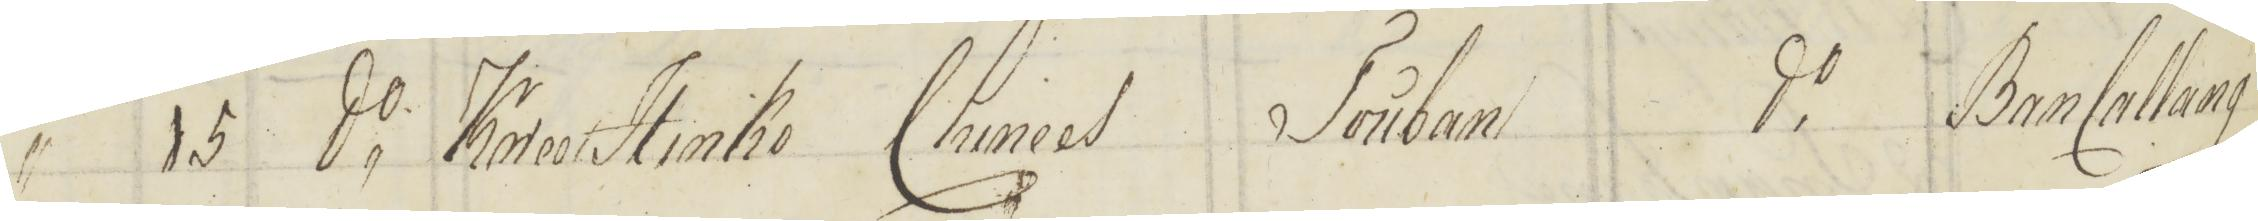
„ 15 d„o Kwee Hinko Chinees Touban d„o Bancallang
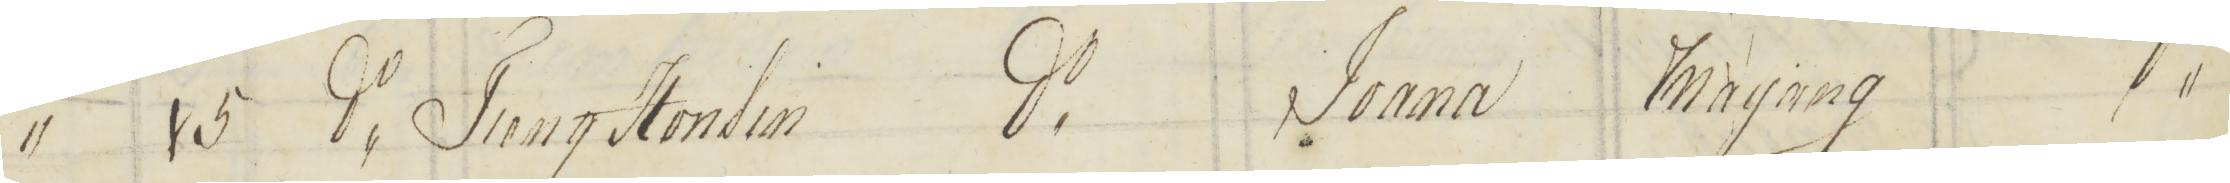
„ 15 d„o Tieng Honsin d„o Joana Maijang d„o
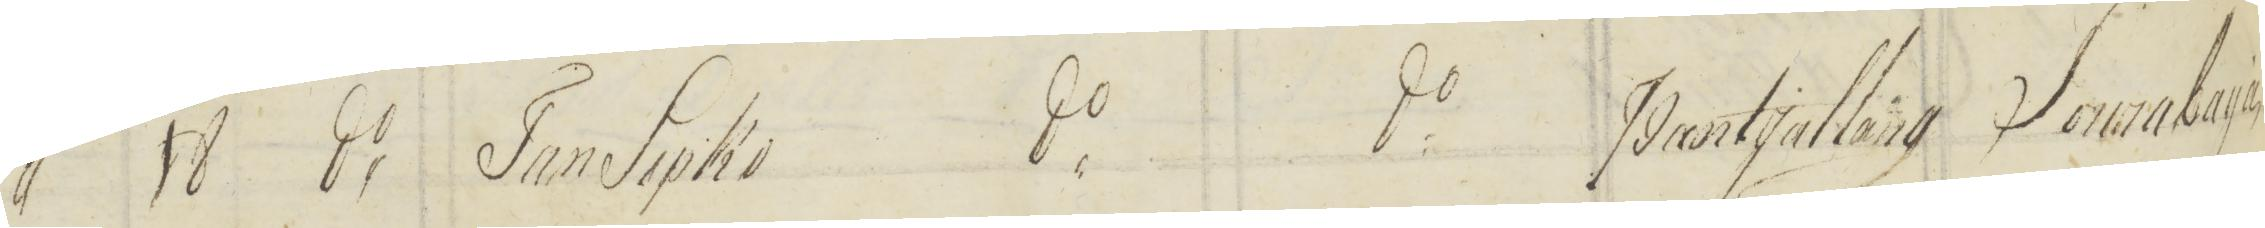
„ 18 d„o Tan Sipko d„o d„o Pantjallang Sourabaija
